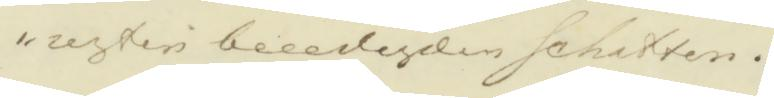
„regter beeedigden Schatten.
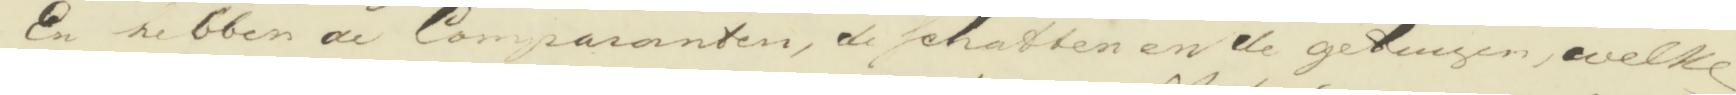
En hebben de Comparanten, de Schatten en de getuigen, welke
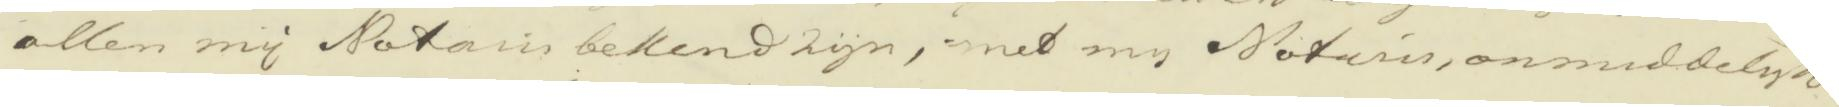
allen mij Notaris bekend zijn, met my Notaris, onmiddelyk
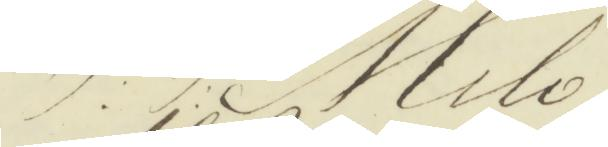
J:G: Milo
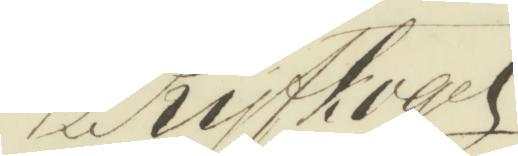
ALRijfkogel
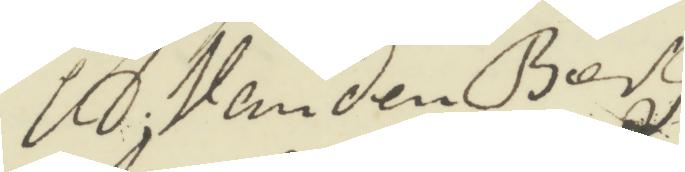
A: Van den Berg
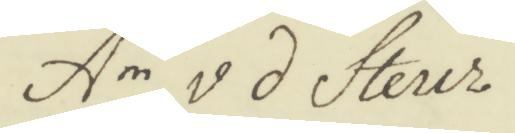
A:m v d Steur
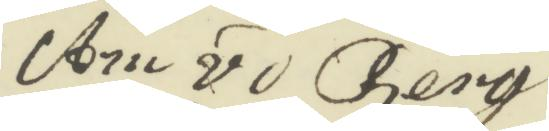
Am vd Berg
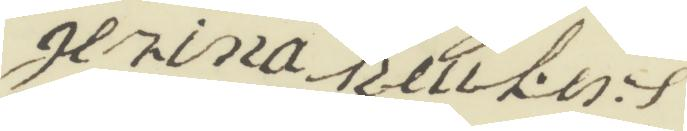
gezina heukers
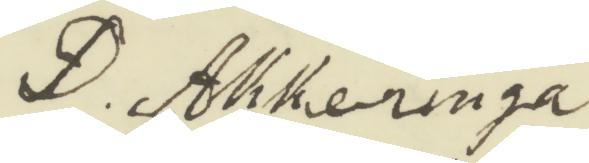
D. Akkeringa
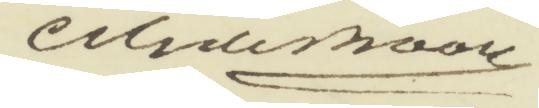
CJGdeBooy
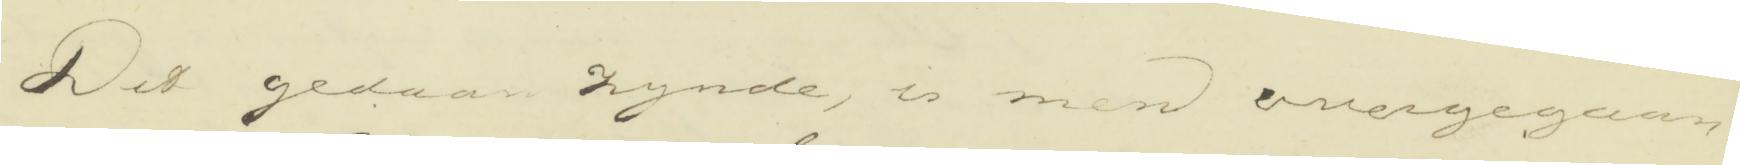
Dit gedaan zynde, is men overgegaan
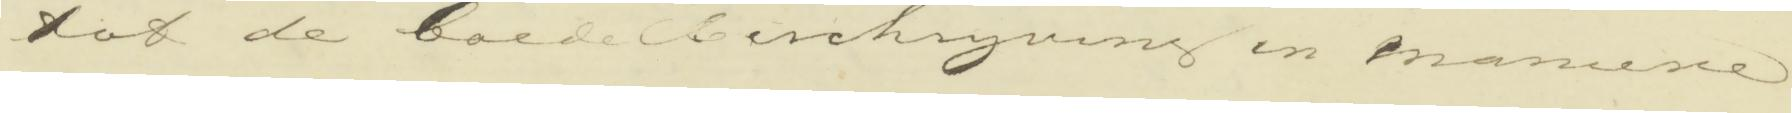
tot de boedelbeschryving in maniere
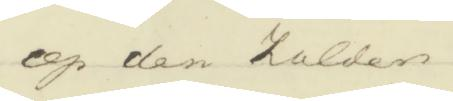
op den Zolder
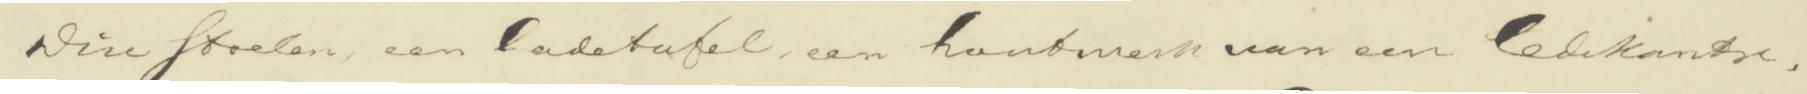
Drie Stoelen, een ladetafel, een houtwerk van een ledikantje,
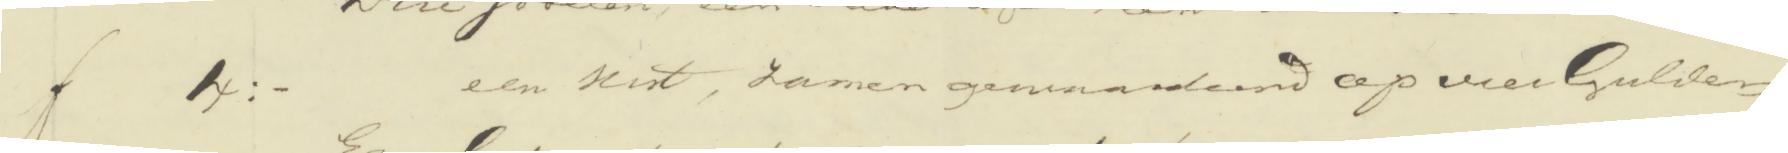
ƒ 4: een kist, zamen gewaardeerd op vier Gulden
